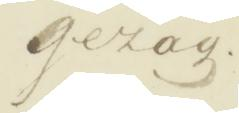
gezag.
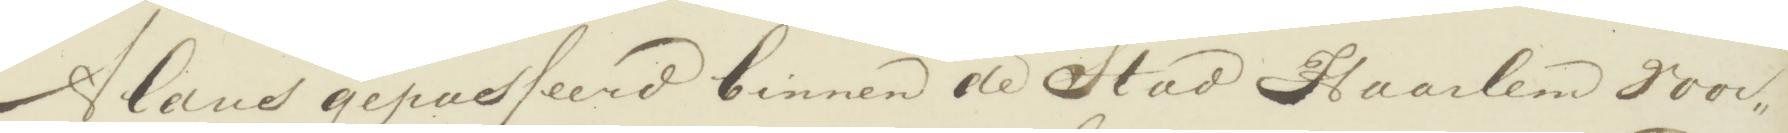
Aldus gepasseerd binnen de stad Haarlem Voor„
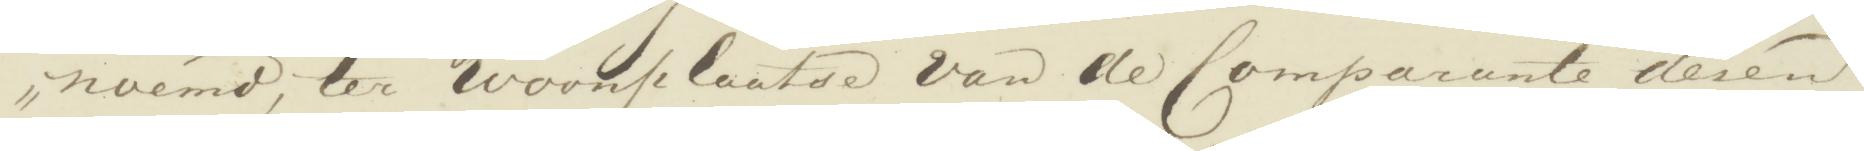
„noemd, ter woonplaatse van de Comparante dezen
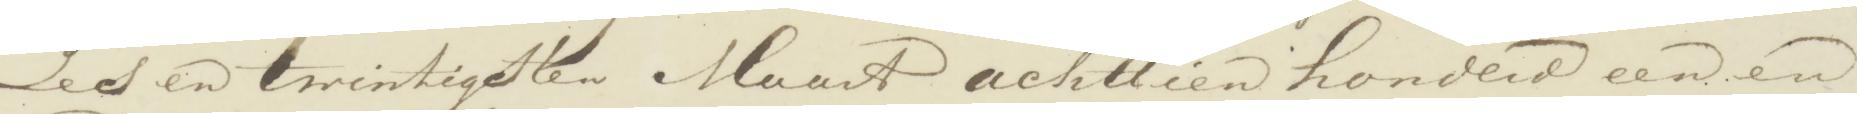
Zes en twintigsten Maart achttien honderd een en
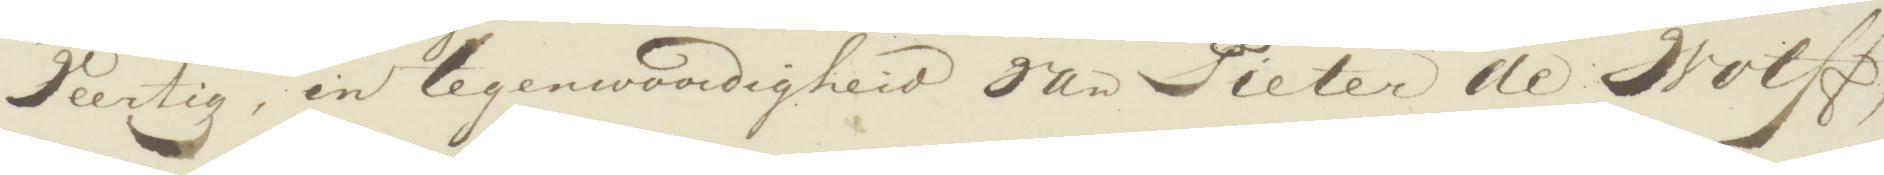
Veertig, in tegenwoordigheid van Pieter de Wolff,
